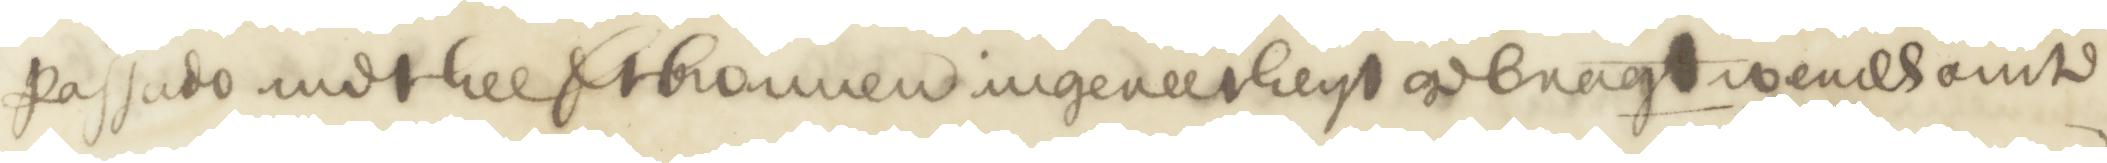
passado niet heeft konnen ingereetheyt gebragt werden om te
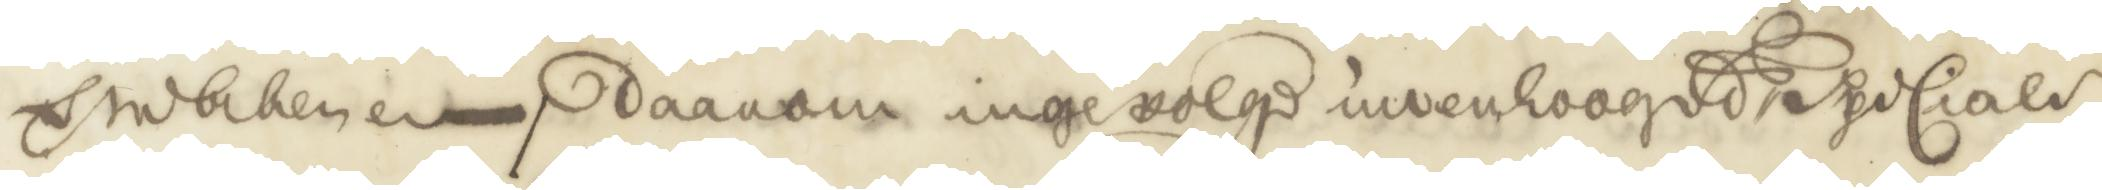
vertrekken en daarom ingevolge uwer hoog Ed„ Speciale
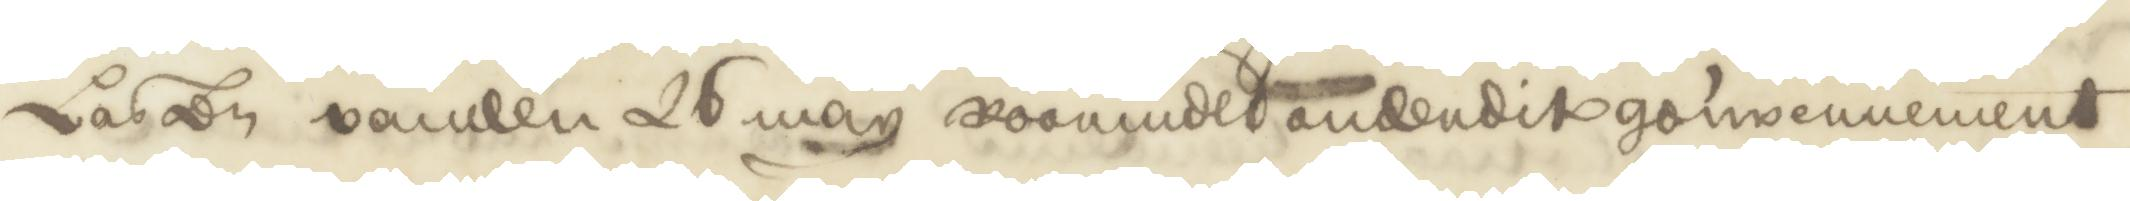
Lasten van den 26 may voormeld onder dit gouvennement
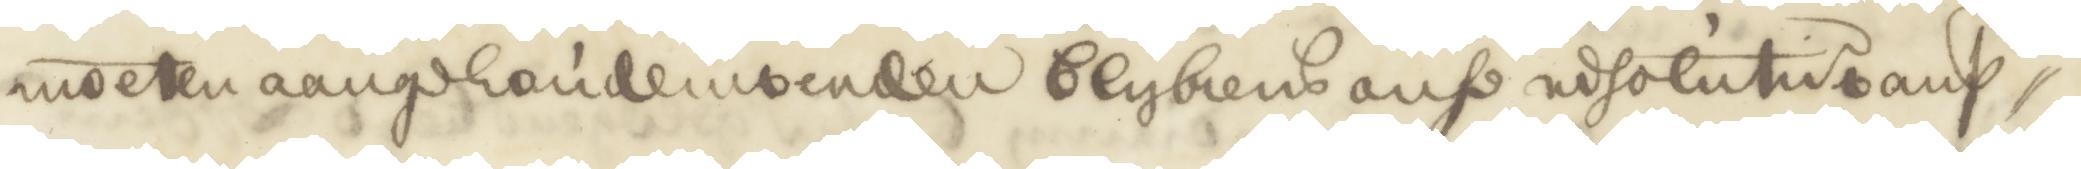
moeten aangehouden werden blykens onse resolutie van p„mo
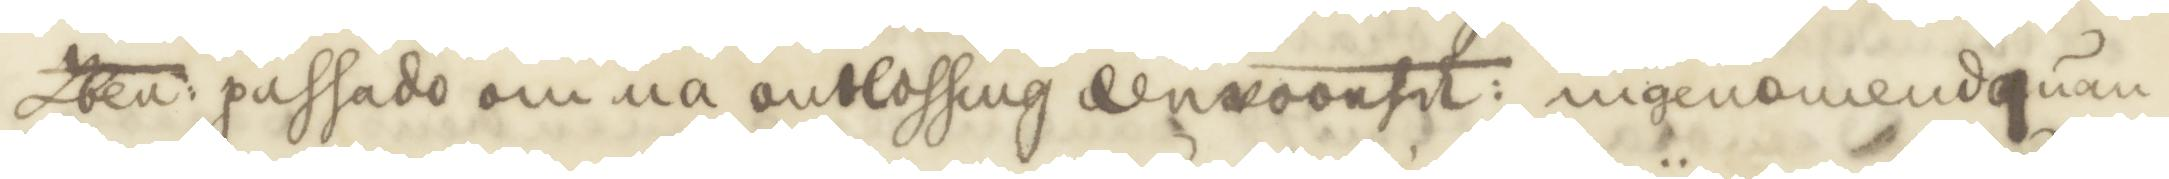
7ber: passado om na ontlossing den voorsch: ingenomene quan
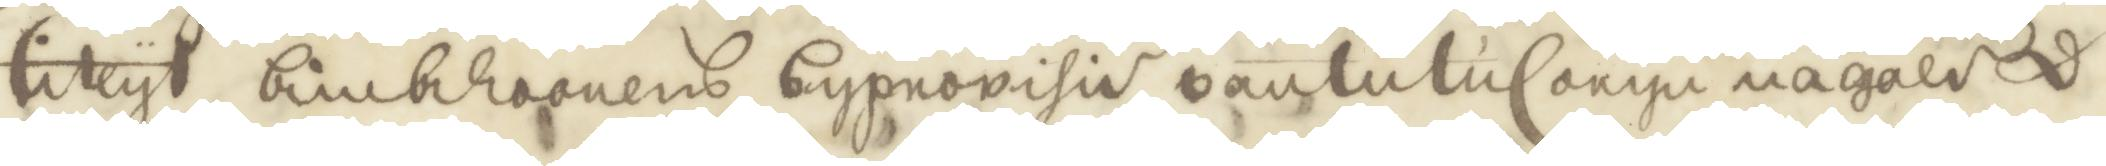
liteijt kinkhoorens by provisie van tutucorijn nagale te
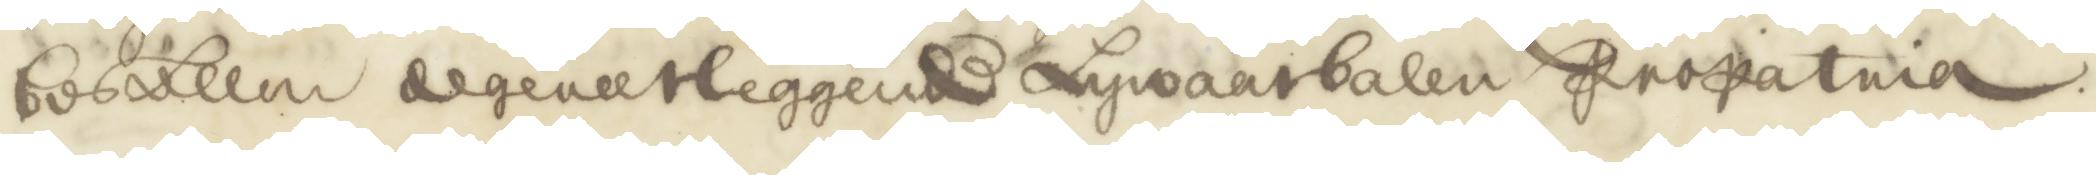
bestellen de gereetleggende Lywaatbalen pro patria.
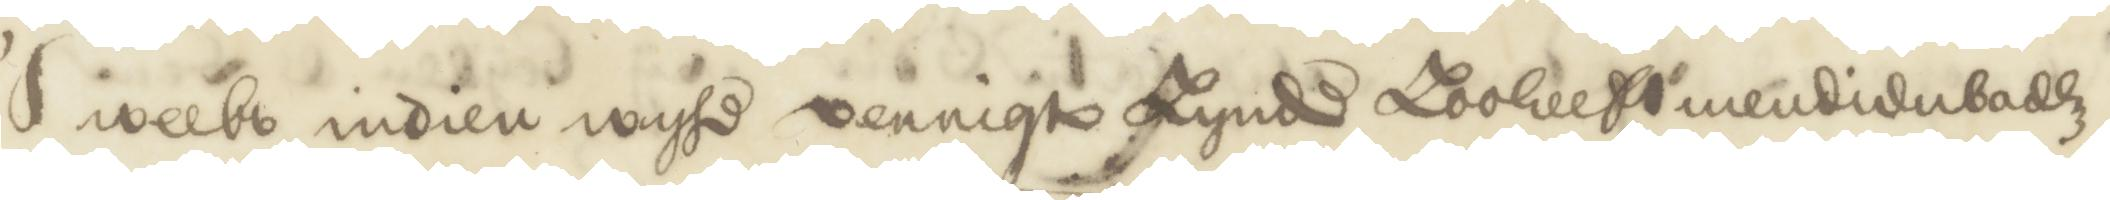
't week indien wyse verrigt Zynde zoo heeft men dien baelen
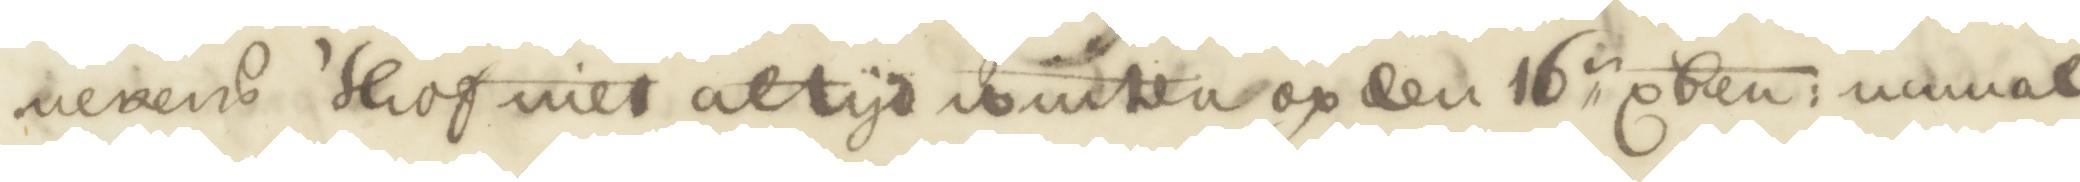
nevens 'thof niet altijd winter op den 16„e xber: na ma
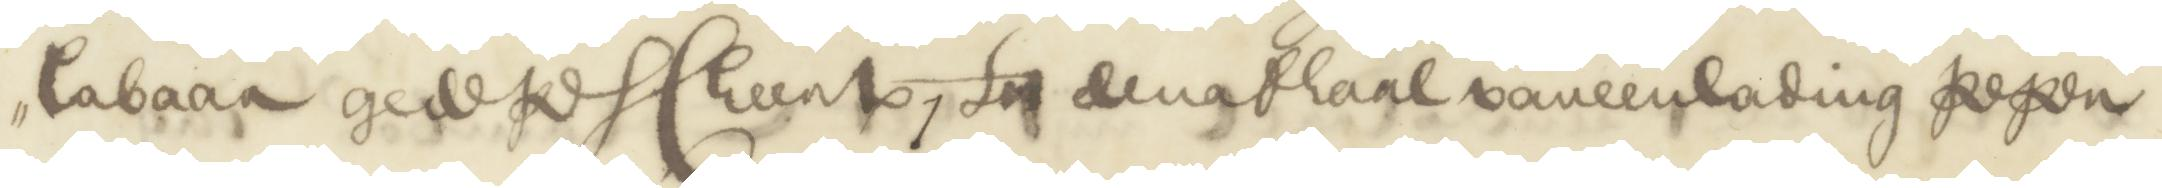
„labaar gedepescheert, tot den afhaal van eenlading peper
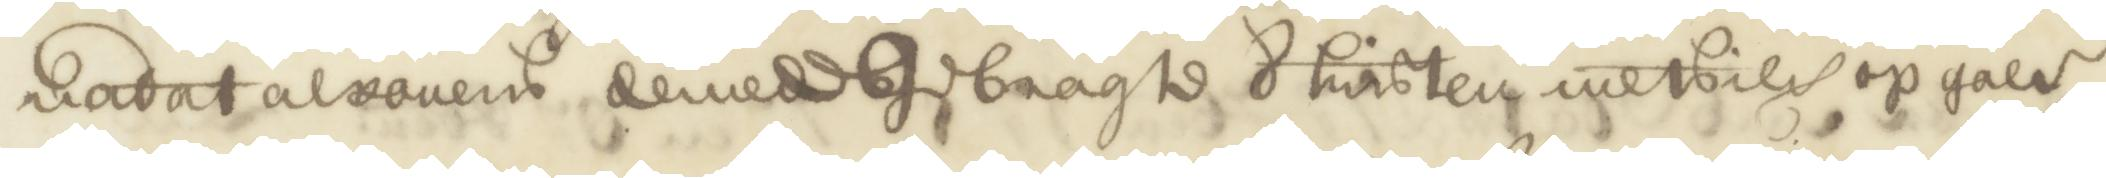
nadat alvorens, demede gebragte 8 kisten metsilver op gale
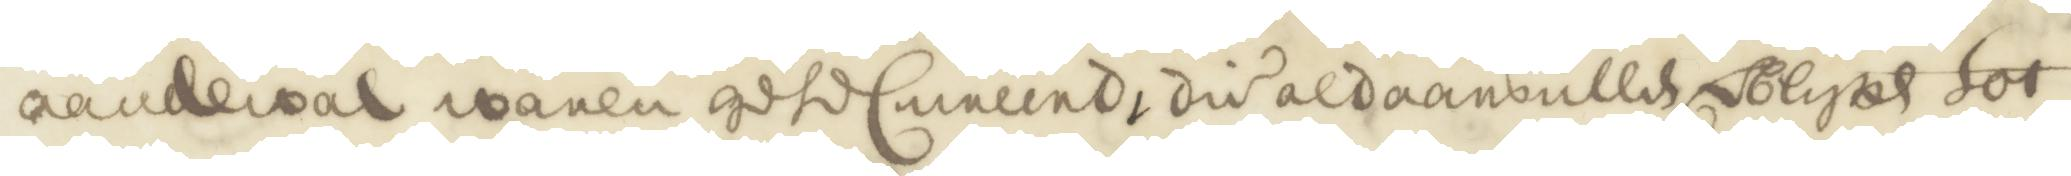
aande wal waren gesecureerd, die aldaar sullen verblyven tot
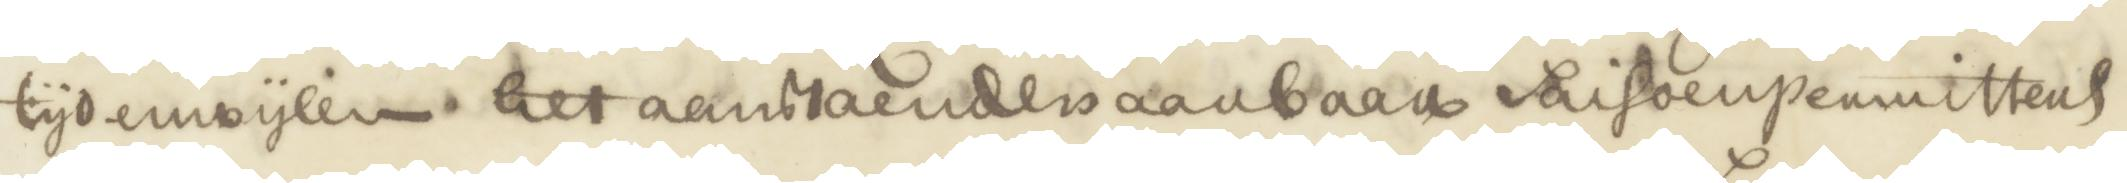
tijd enwijlen het aanstaende vaarbaar saisoen permitteren
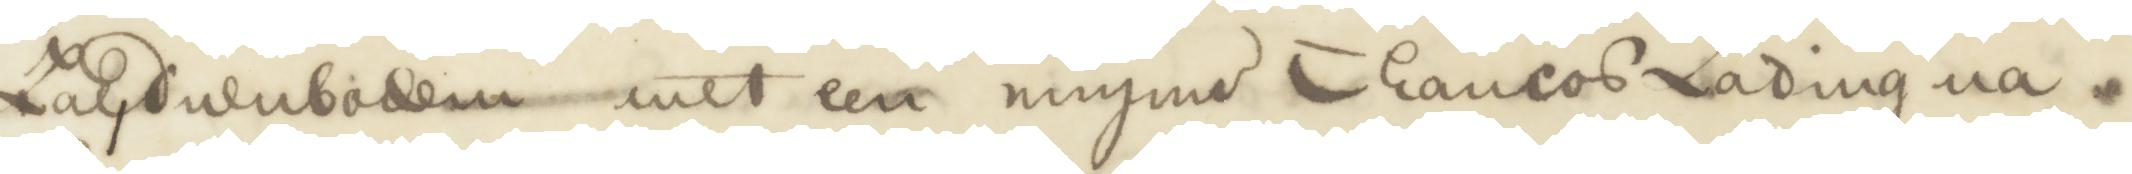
Zal/ dien bodem met een ruijme Chancos Lading na„
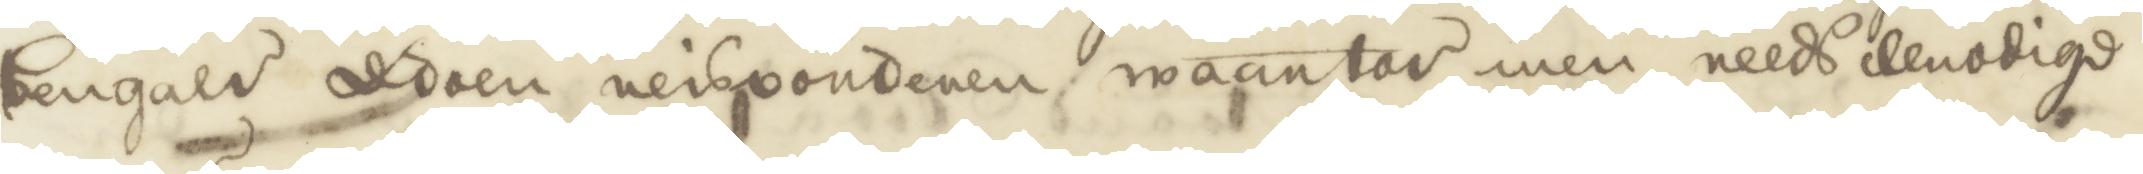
bengale te doen reisvonderen waartoe men reeds denodige
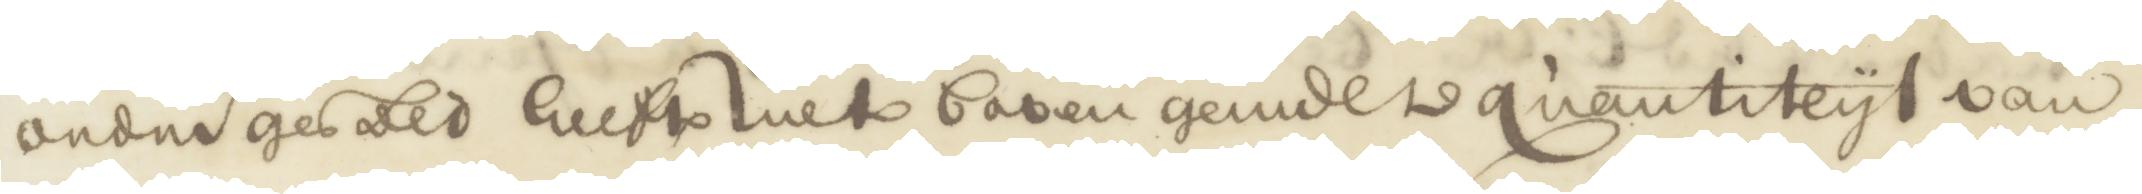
ordre gesteld heeft met boven gemelte quantiteijt van
